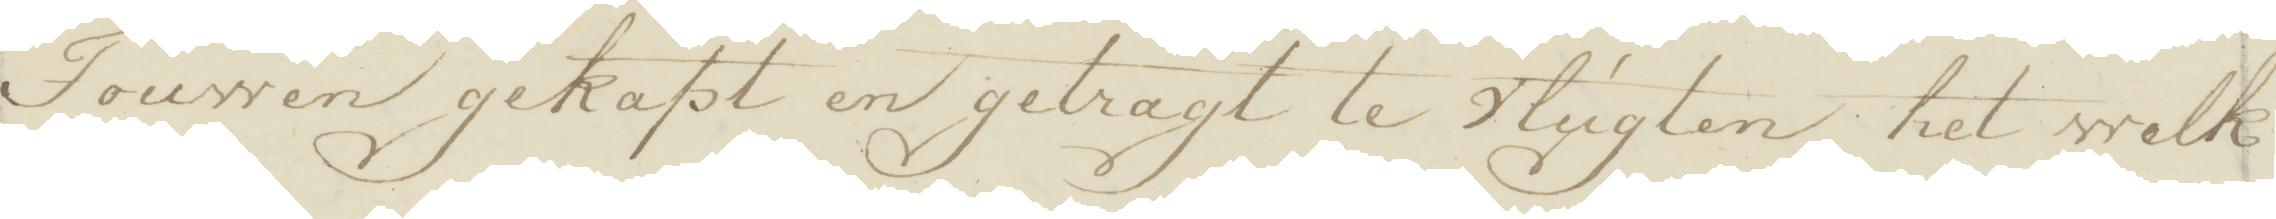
Touwen gekapt en getragt te vlugten, het welk
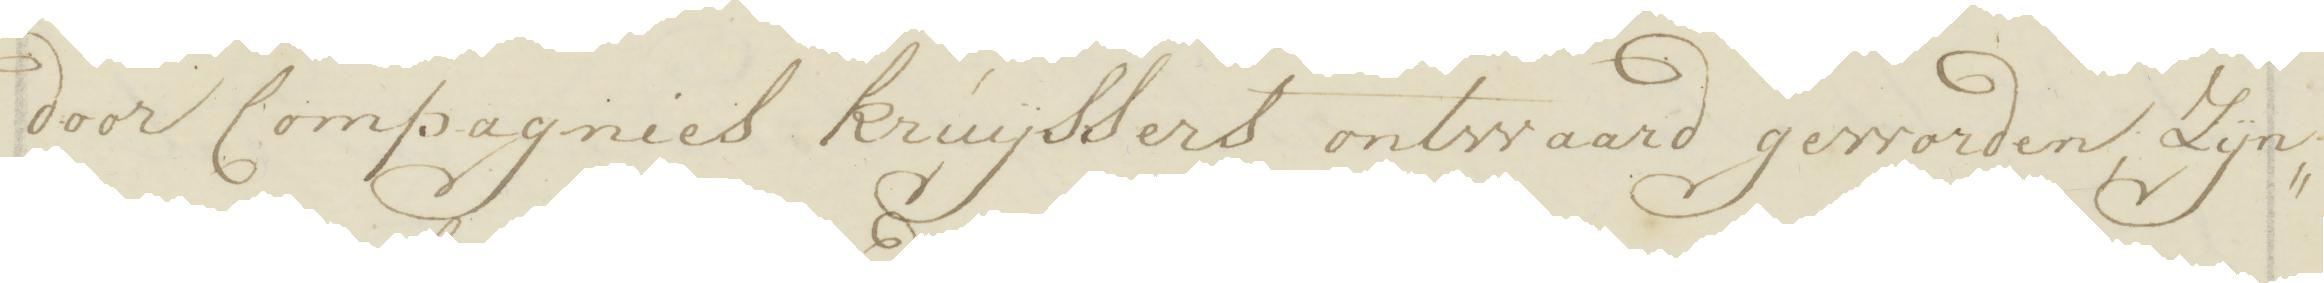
door compagnies kruijssers ontwaard geworden, zijn„
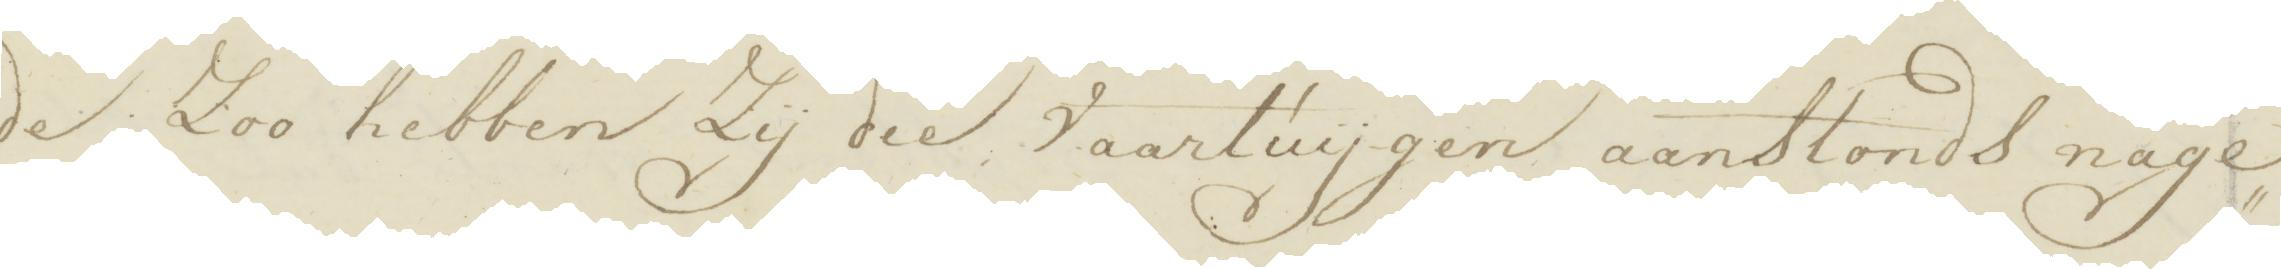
de, zoo hebben zij die vaartuijgen aanstonds nage„
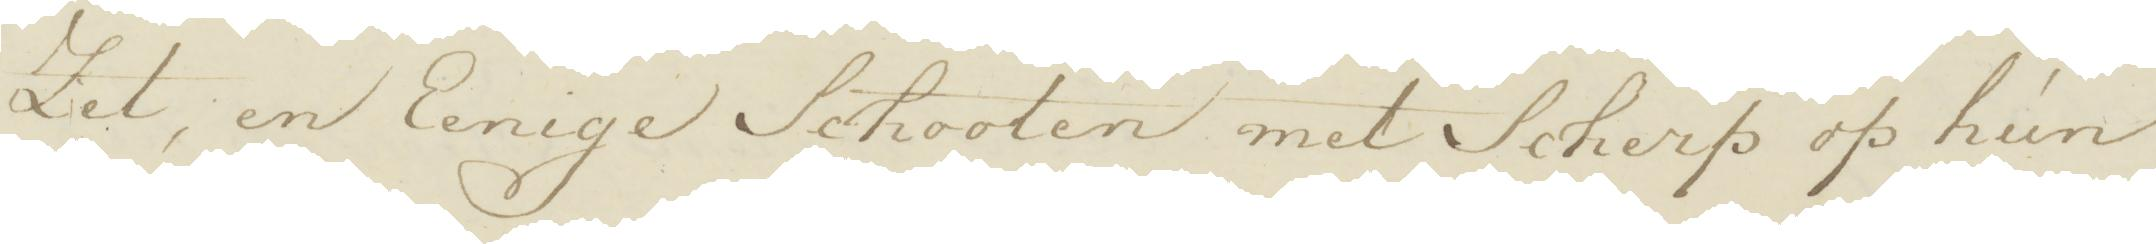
zet, en Eenige schooten met scherp op hun
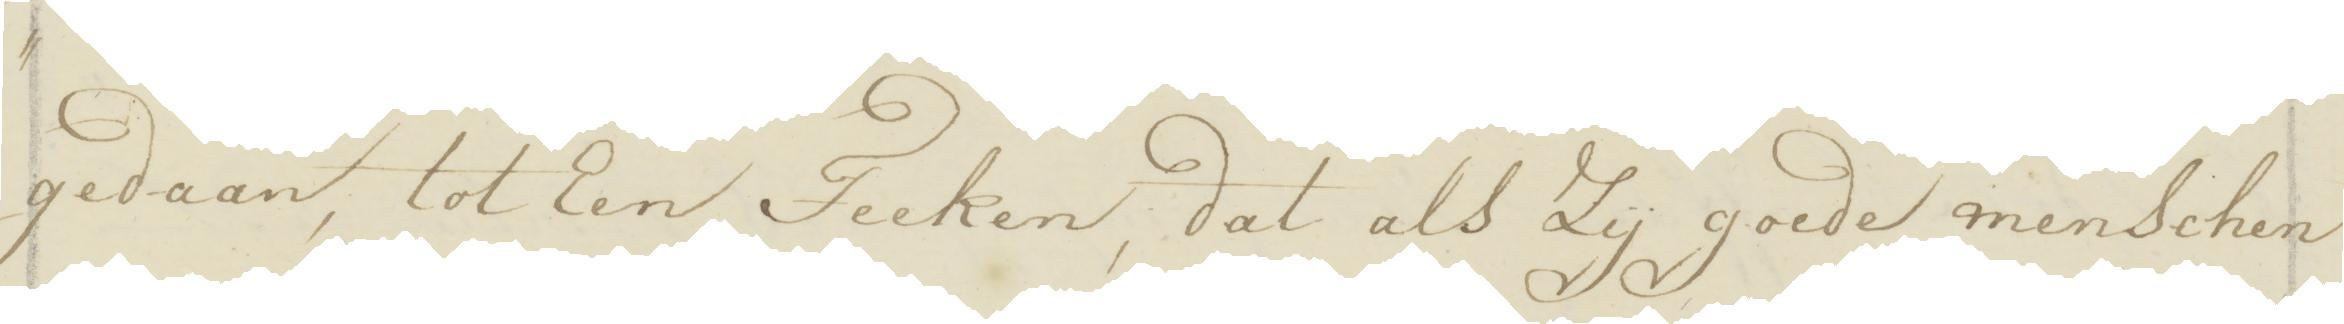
gedaan, tot Een Teeken, dat als zij goede menschen
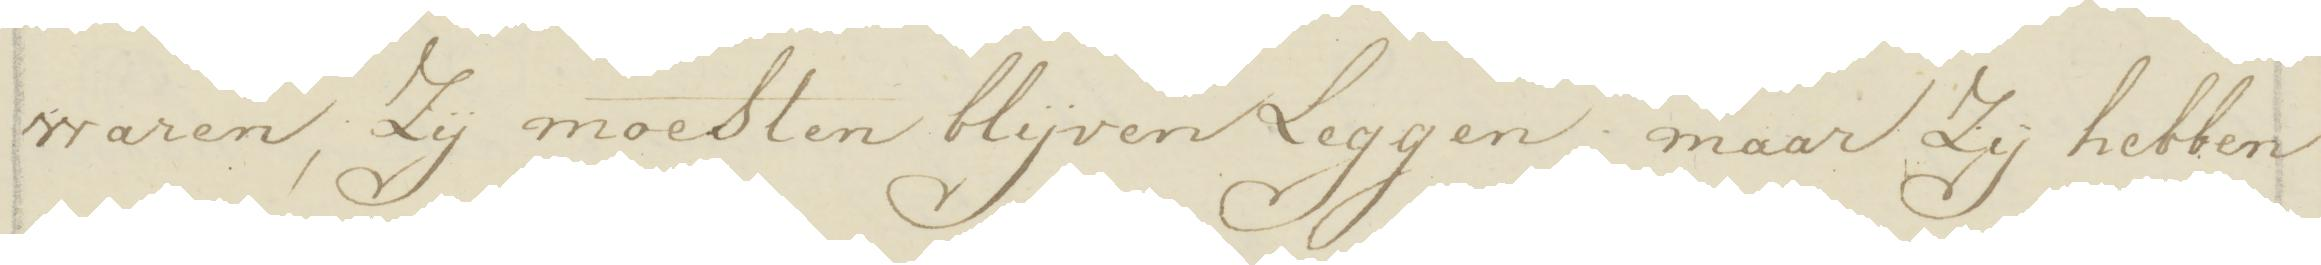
waren, zij moesten blijven leggen, maar zij hebben
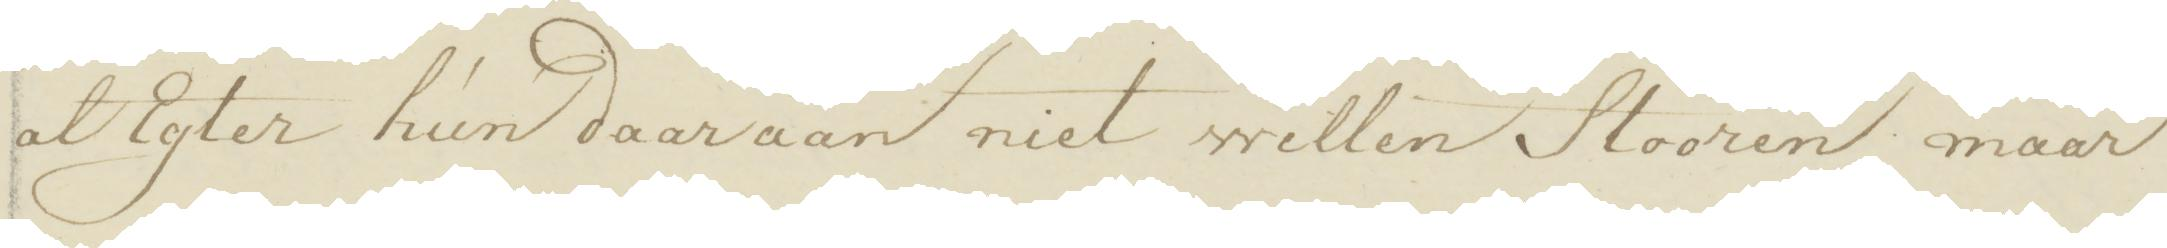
al Egter hun daar aan niet willen stooren, maar
